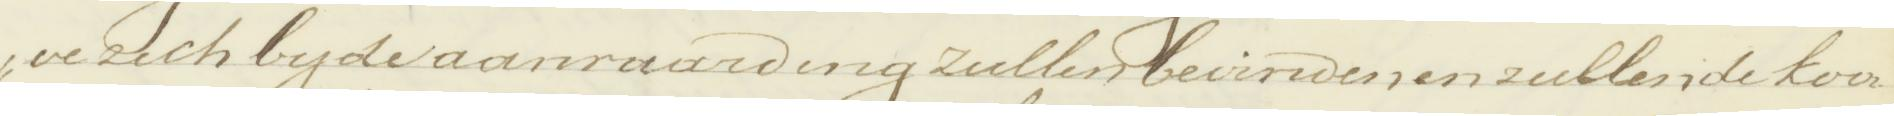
„ve zich by de aanvaarding zullen bevinden en zullen de koo
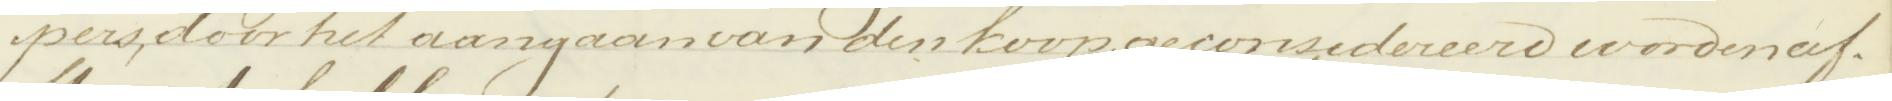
pers, door het aangaan van den koop, geconsidereerd worden af,
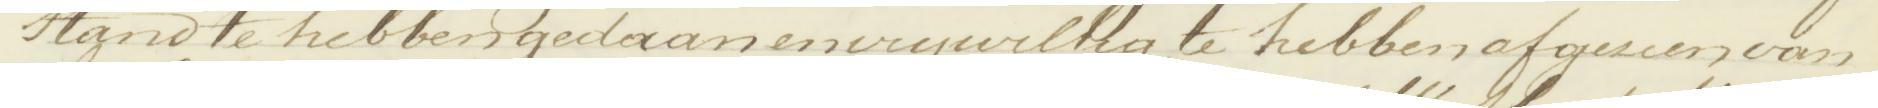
stand te hebben gedaan en vrywillig te hebben afgezien van
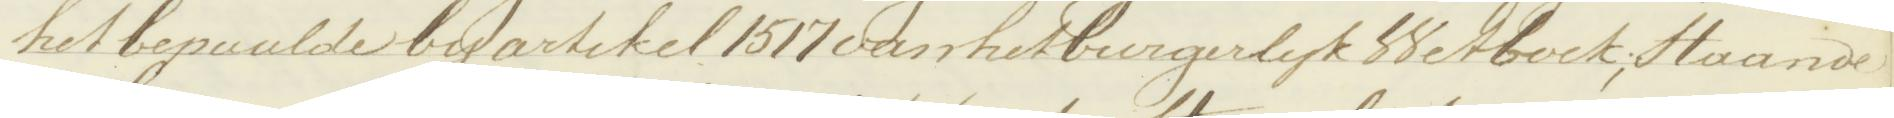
het bepaalde by artikel 1517 van het burgerlyk Wetboek, Staande
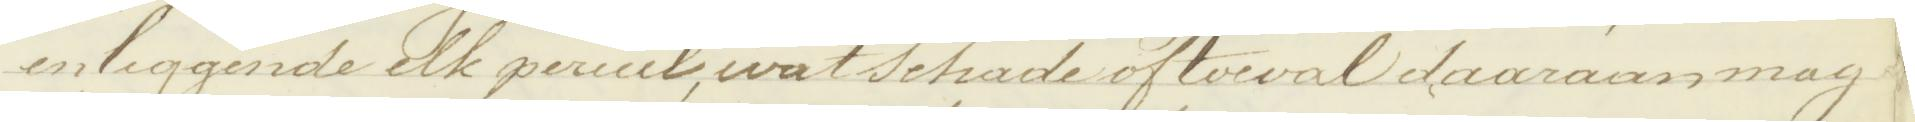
en liggende elk perceel, wat Schade of toeval daaraan mag
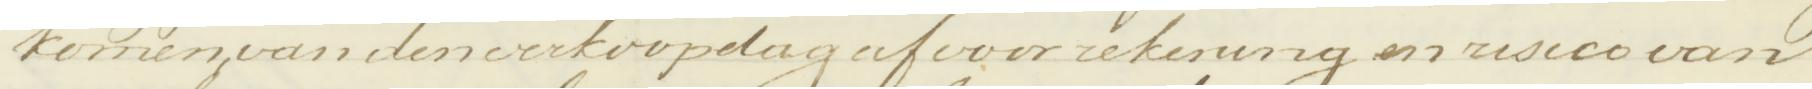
komen, van den verkoopdag af voor rekening en risico van
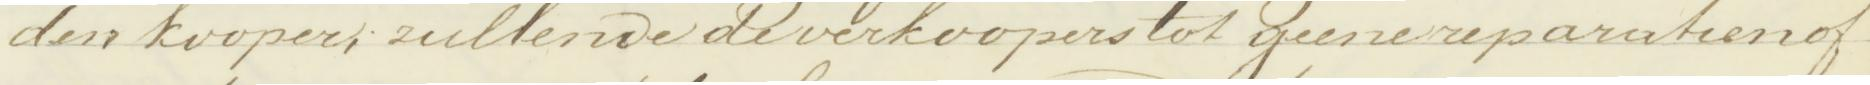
den kooper, zullende de verkoopers tot geene reparatien of
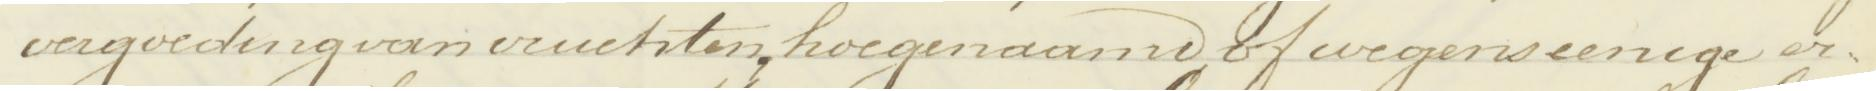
vergoeding van vruchten, hoegenaamd of wegens eenige er„
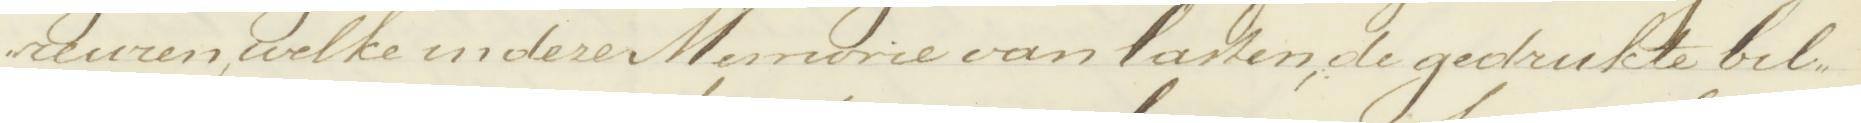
„reuren, welke in dezer Memorie van lasten, de gedrukte bil„
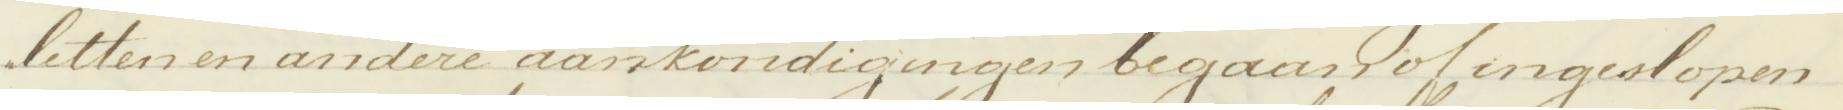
„letten en andere aankondigingen begaan of ingeslopen
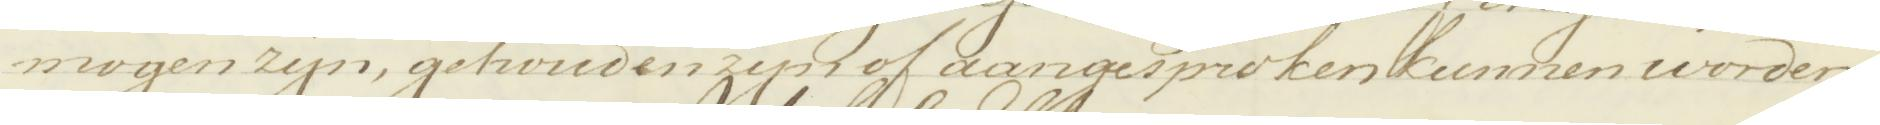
mogen zyn, gehouden zyn of aangesproken kunnen worden-
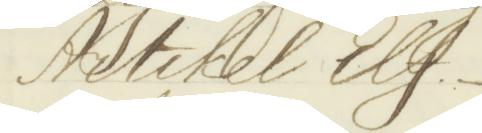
Artikel Elf.-
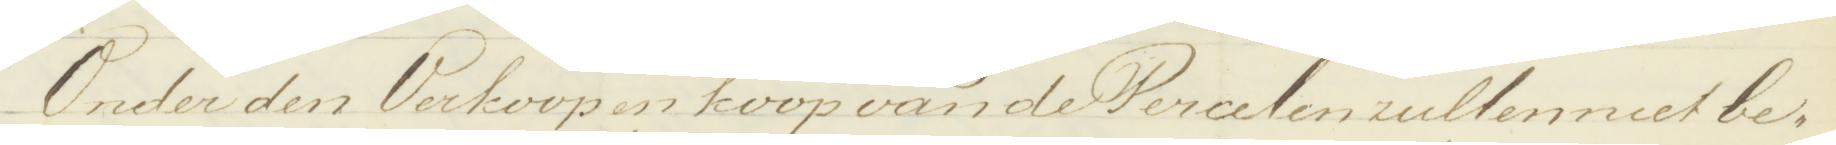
Onder den Verkoop en koop van de Percelen zullen niet be„
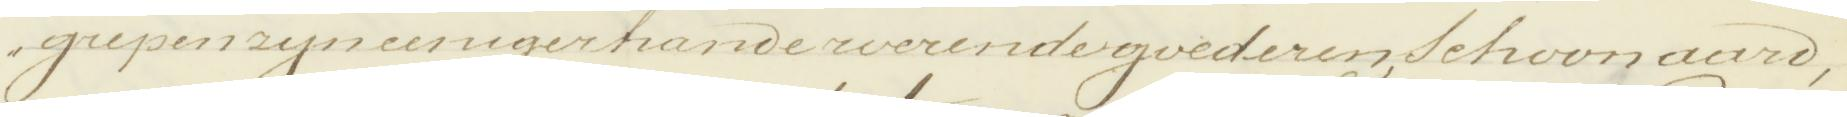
„grepen zyn eenigerhande roerende goederen, Schoon aard,
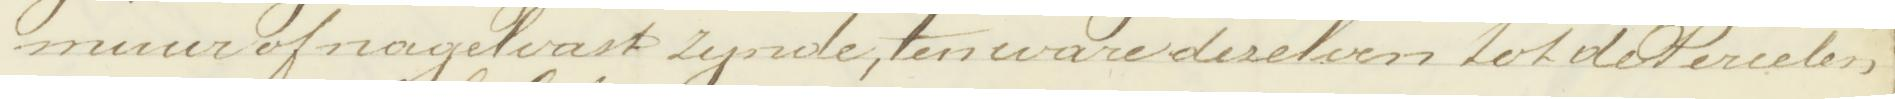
muur of nagelvast zynde, ten ware dezelven tot de Percelen
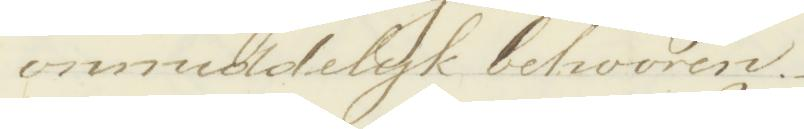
onmiddelyk behooren.
